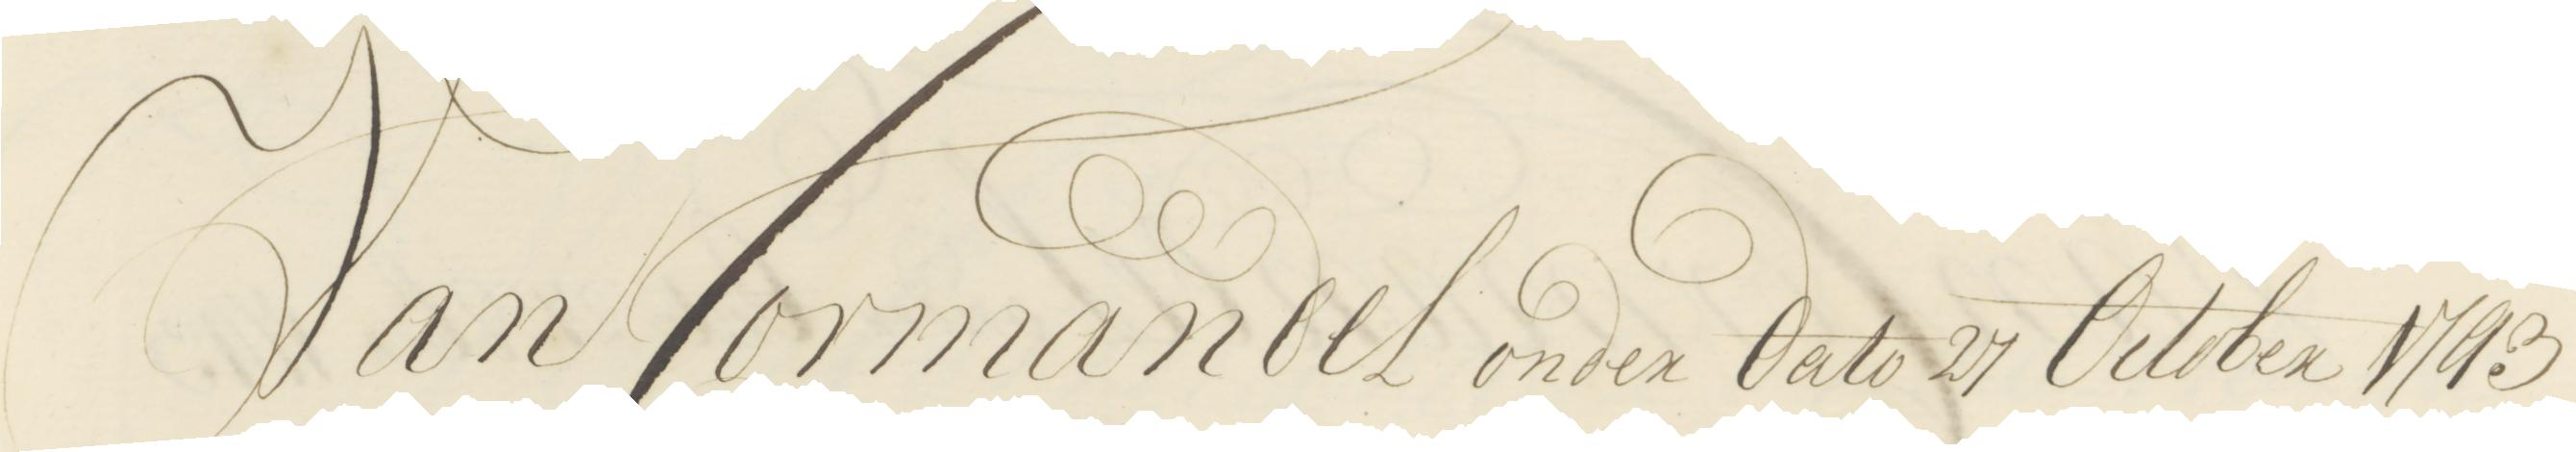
Van Cormandel onder dato 27 October 1743
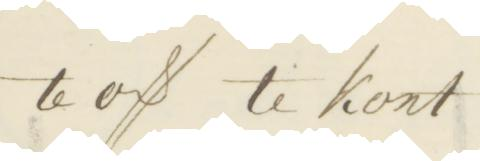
te over te kort
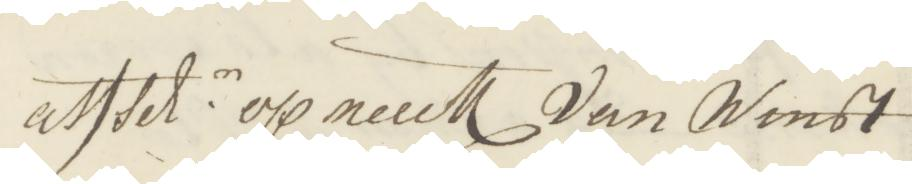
affsch:n op reeck van winst
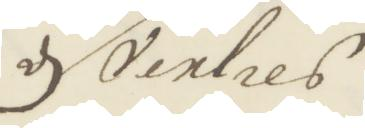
en verlies
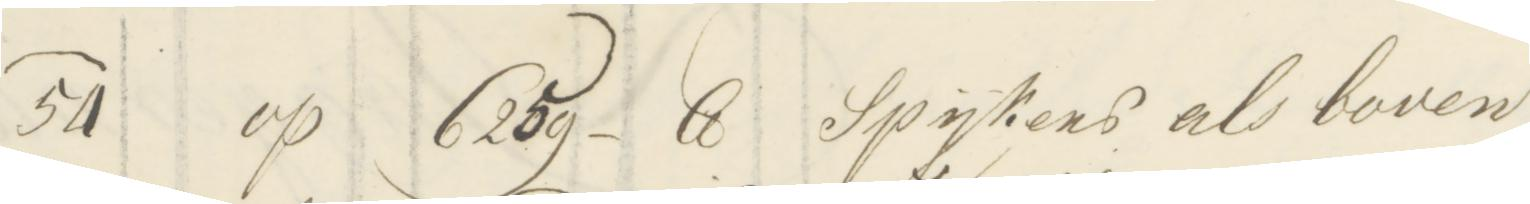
54 op 6259 — lb spijkers als boven
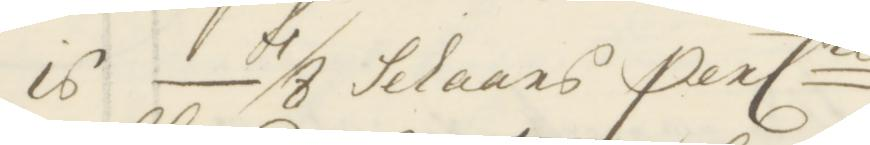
is — 1/8 schaars perC=to
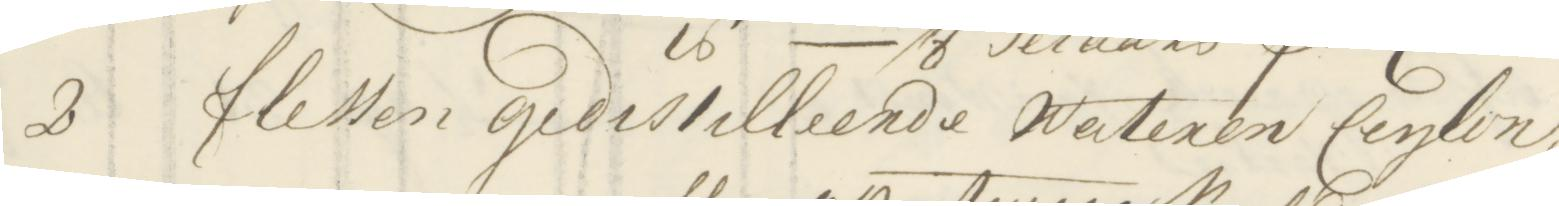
2 flessen gedistilleerde wateren Ceylon
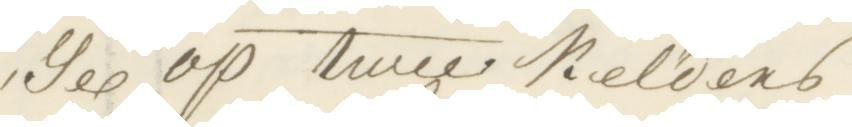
,se op twee kelders
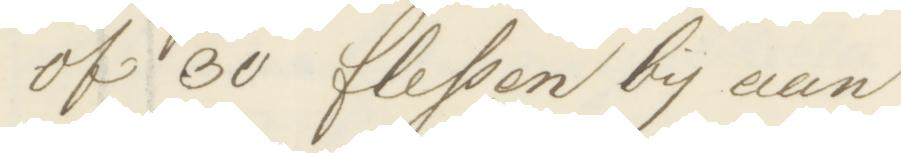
of 30 flessen bij aan
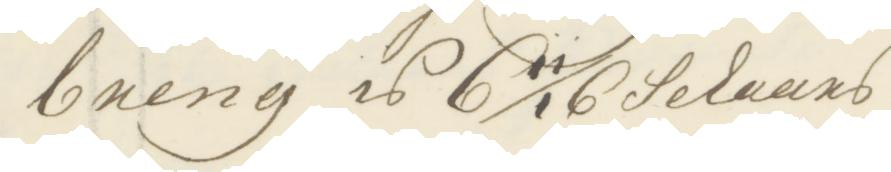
breng is 6 11/16 schaars
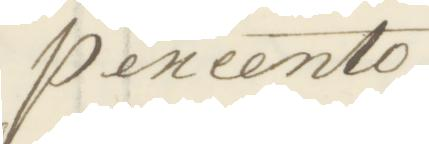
per cento
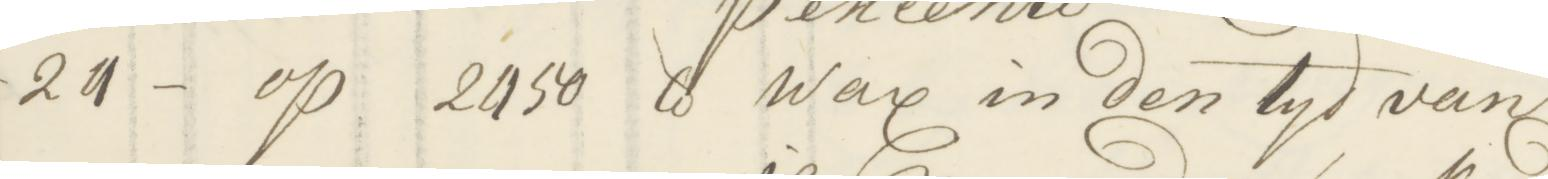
24 — op 2450 lb wax in den tyd van
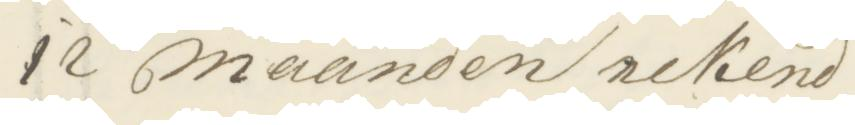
12 maanden rekend
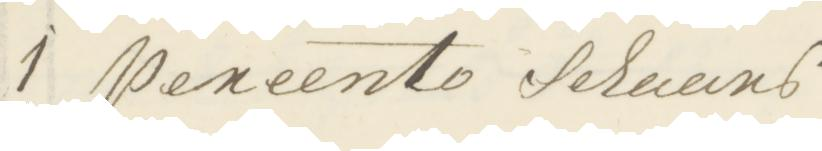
1 per cento schaars
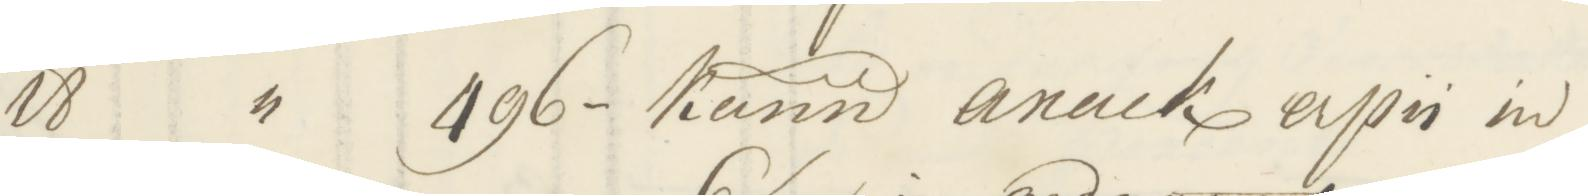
18 „ 496 — kann arack apii in
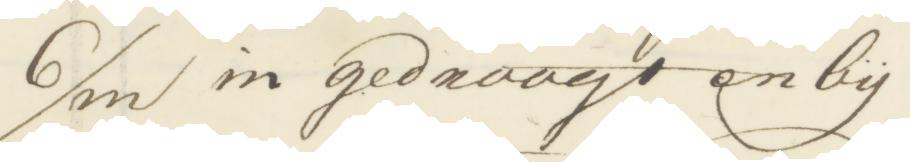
6/m in gedraagt en bij
